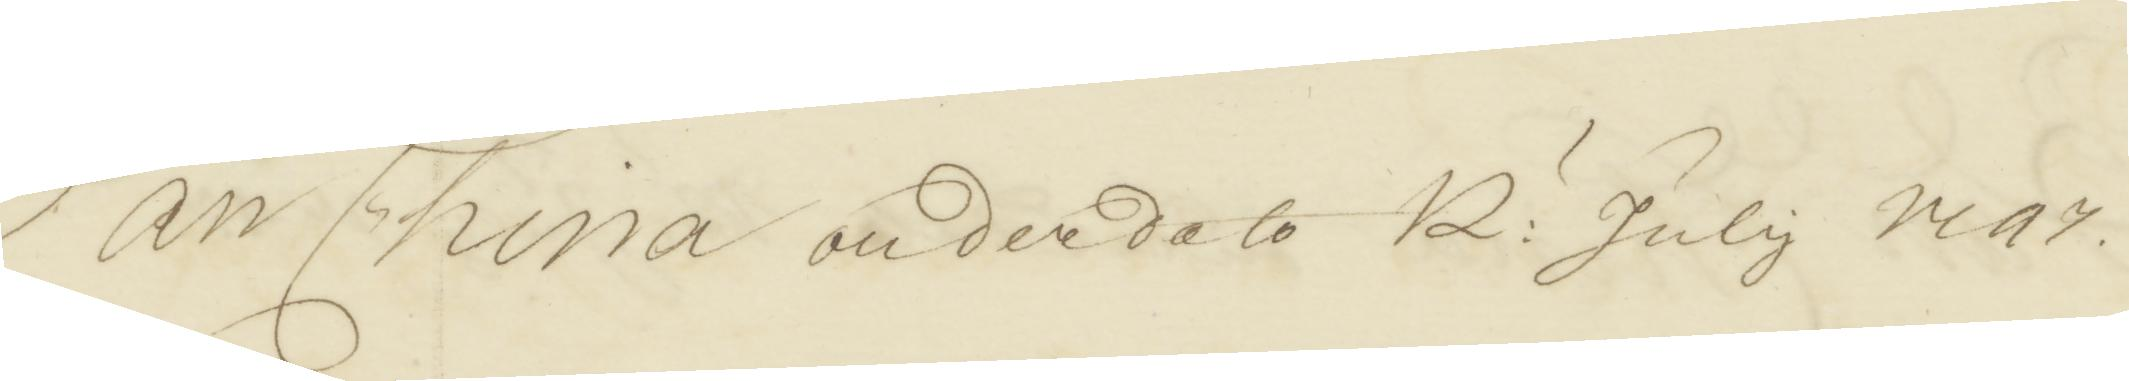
Van China onder dato 12:' Julij 1747.
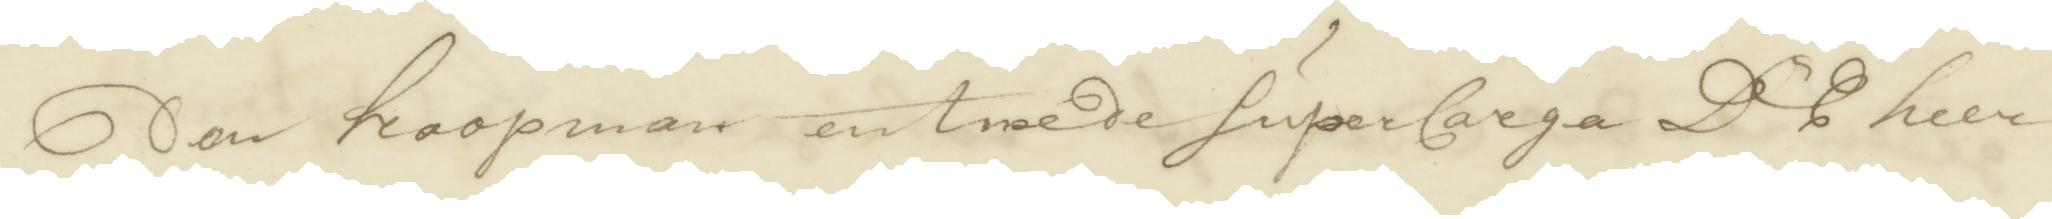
den koopman en twede supercarga D' E heer
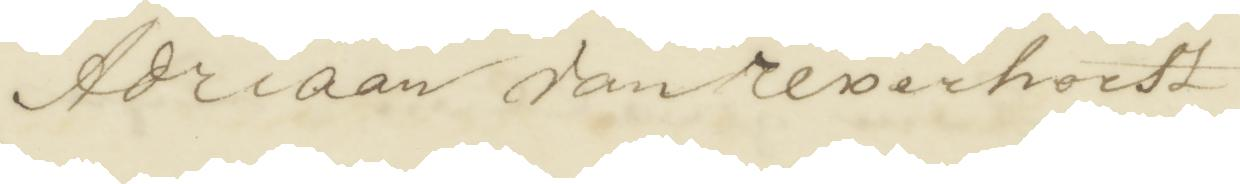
Adriaan van reverhorst
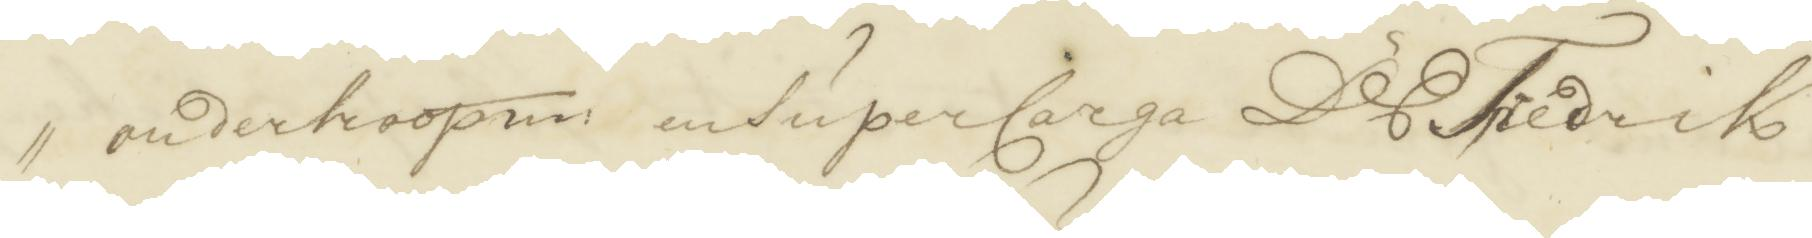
„ onderkoopm: en supercarga D' E Fredrik
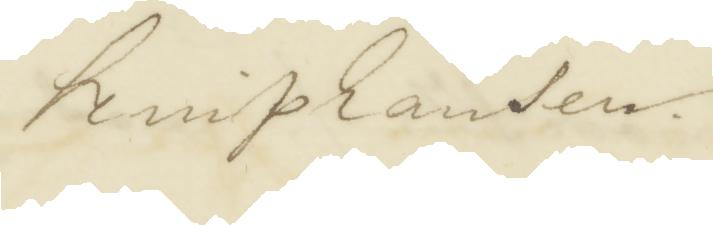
kniphausen.
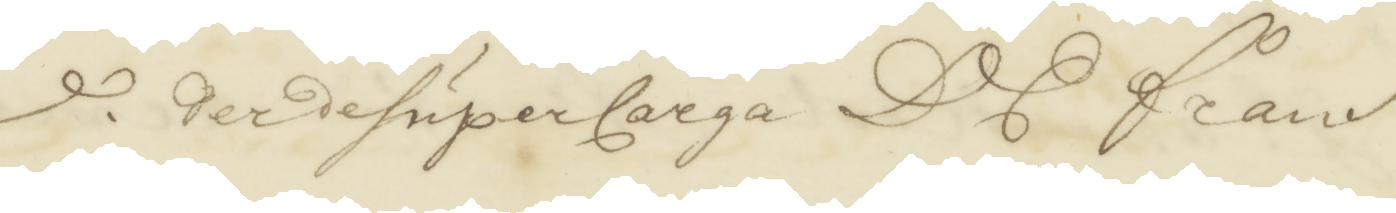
_.o der de supercarga D' E frans
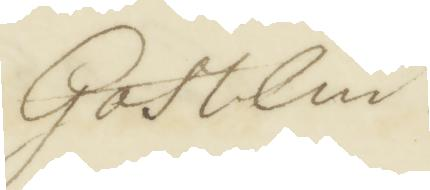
Gostlin
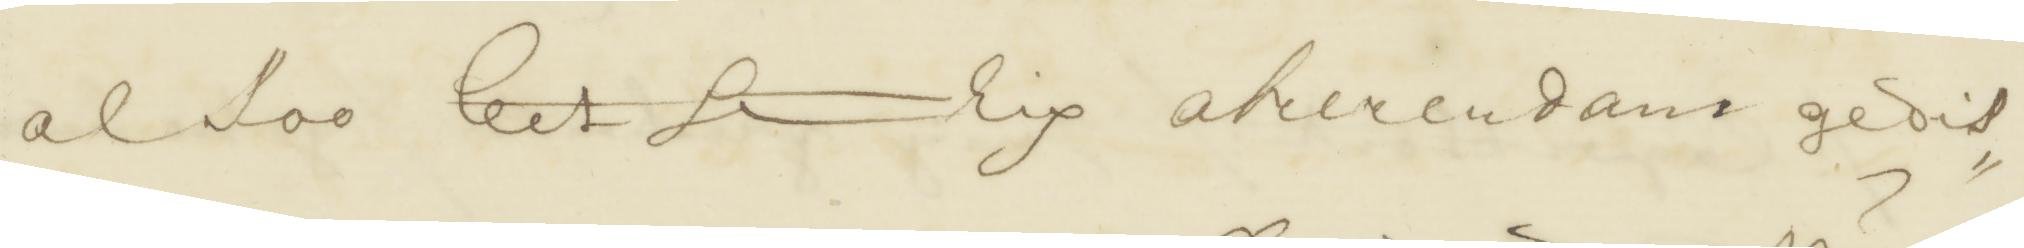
al soo het schip akerendam gedis„
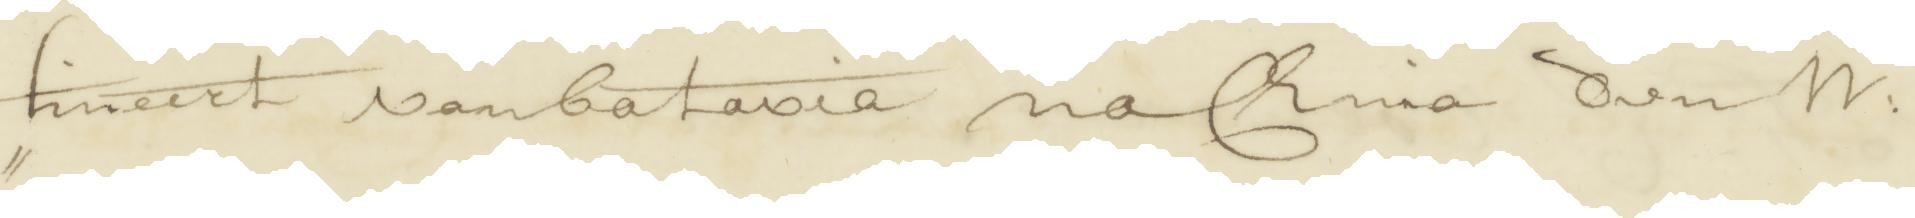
„tineert van batavia na China den 11:'
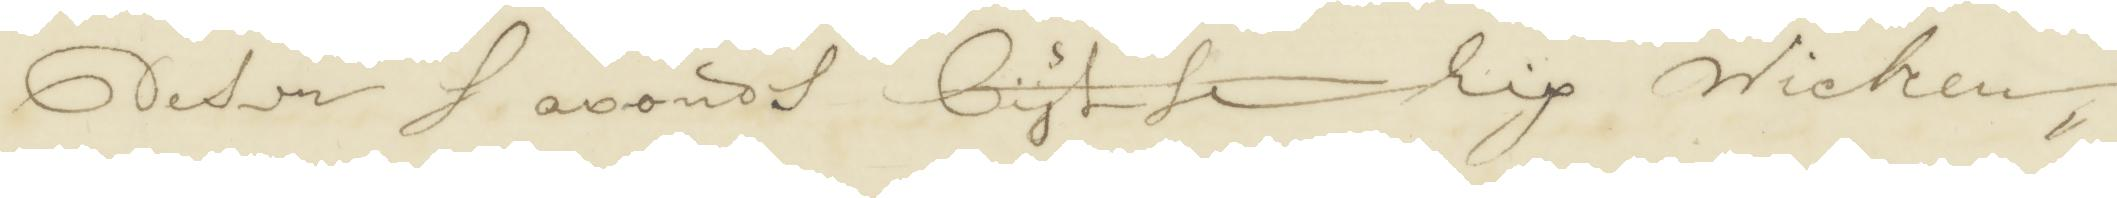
deser 's avonds bij't schip wicken„
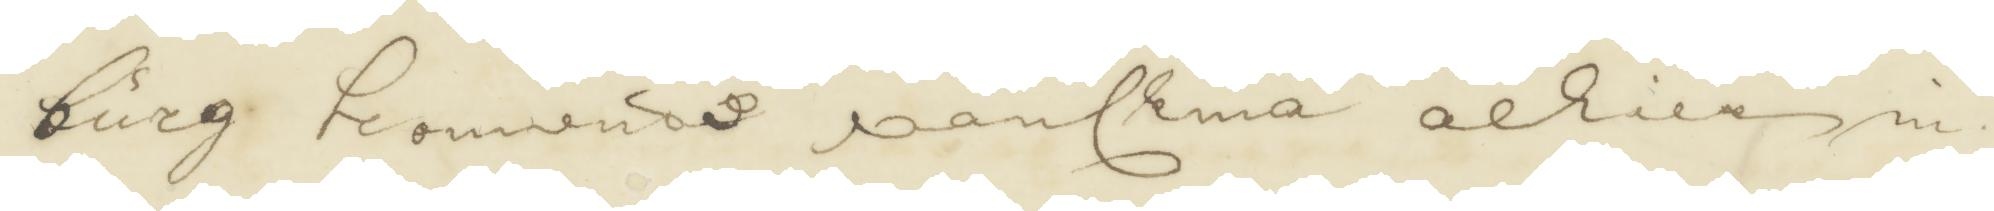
burg komende van China alhier in
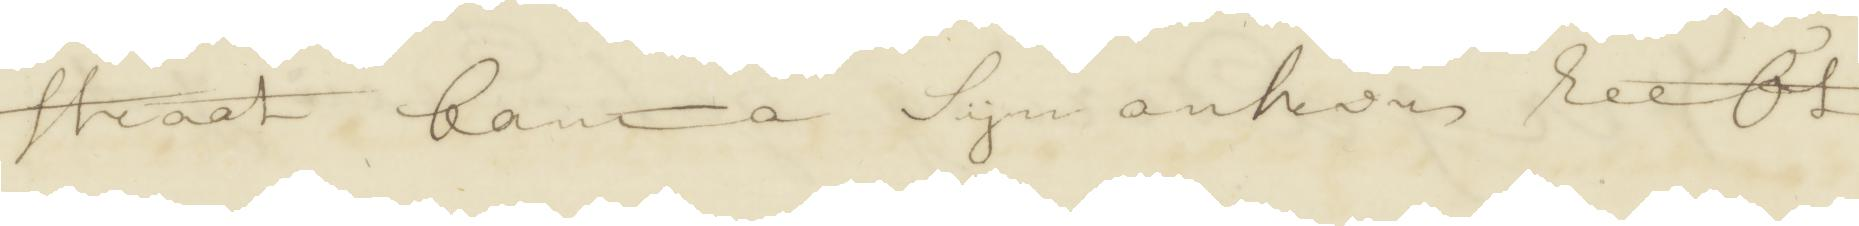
straat banca sijn anker heeft
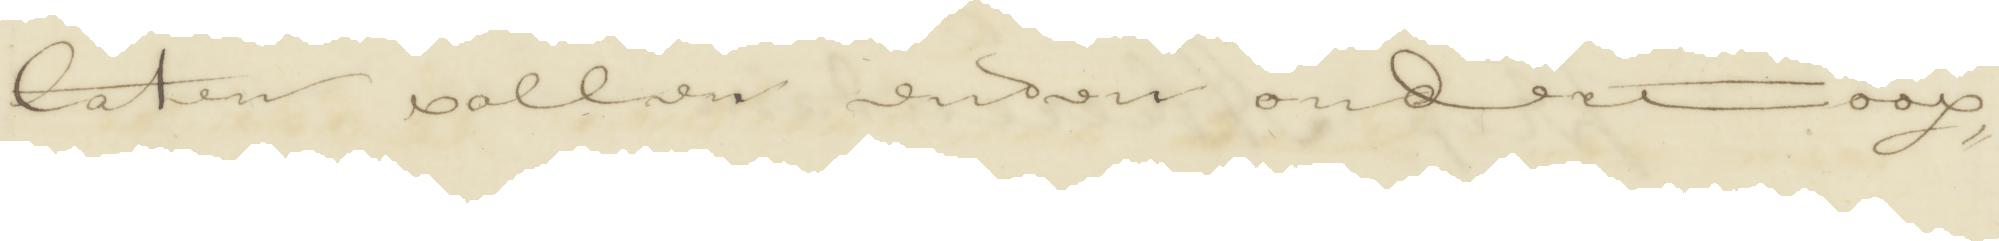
laten vallen enden ondercoop„
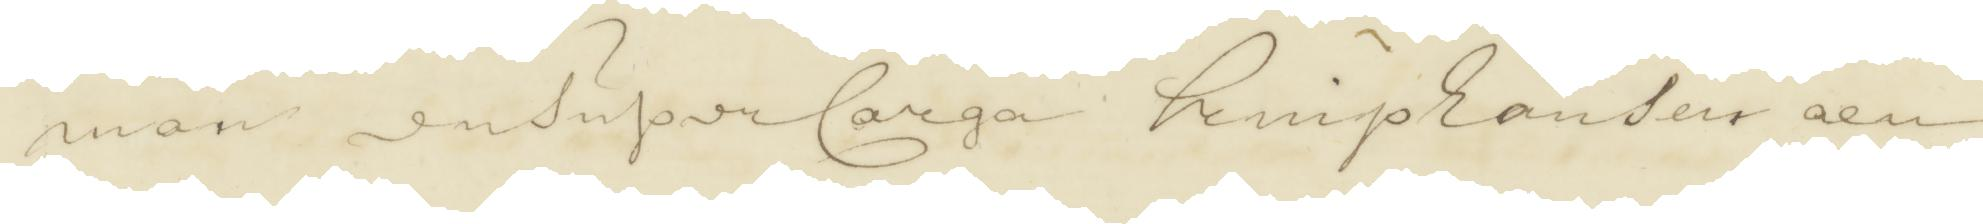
man en supercarga kniphausen aen
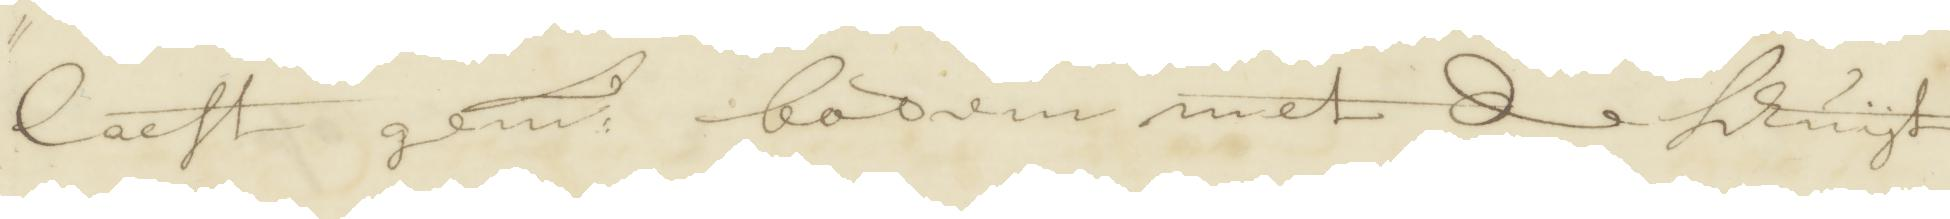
laest gem: bodem met de schuijt
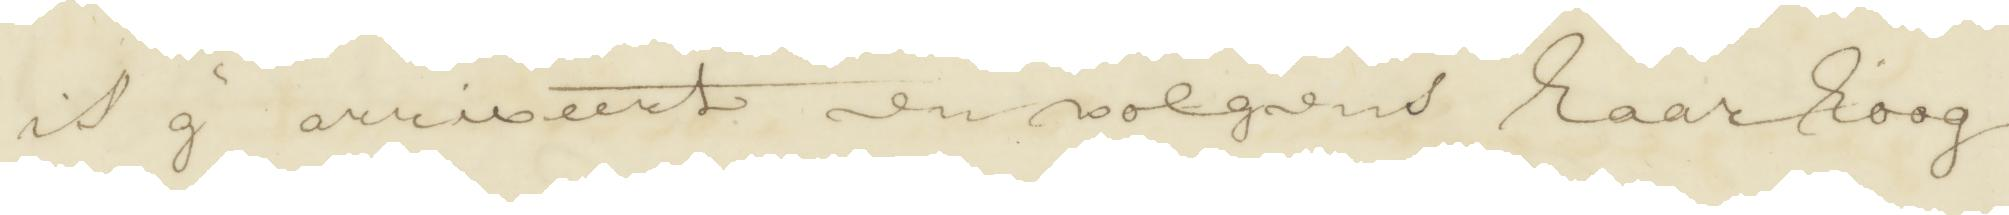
is g’arriveert en volgens haar hoog
